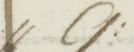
„ 9:
